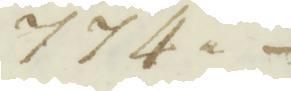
774 „ —
